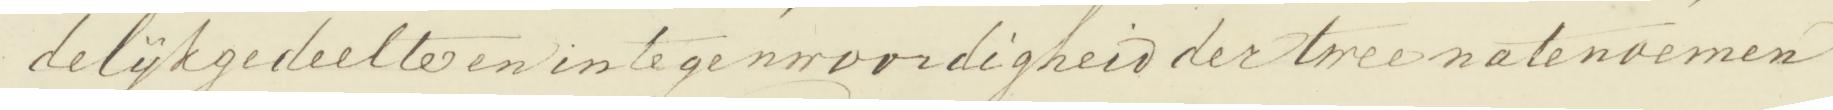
delijk gedeelte en in tegenwoordigheid der twee na tenoemen
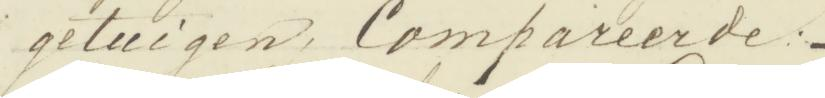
getuigen, Compareerde.-
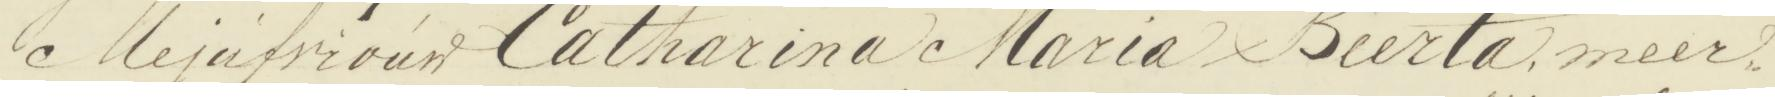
Mejufvrouw Catharina Maria Beerta, meer„
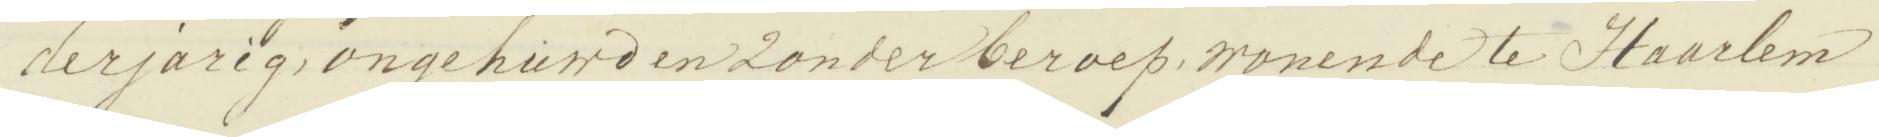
derjarig, ongehuwd en zonder beroep, wonende te Haarlem
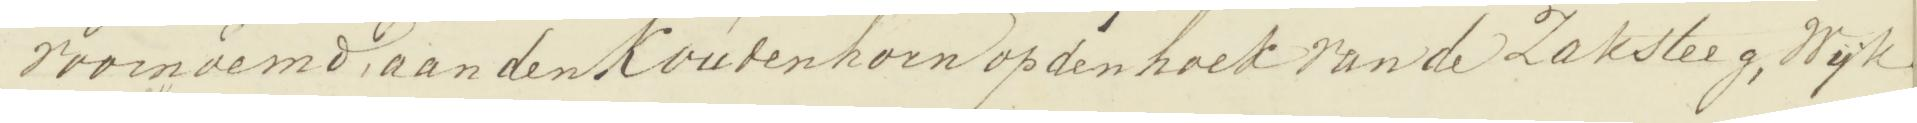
voornoemd, aan den Koudenhorn op den hoek van de Zaksteeg, Wijk
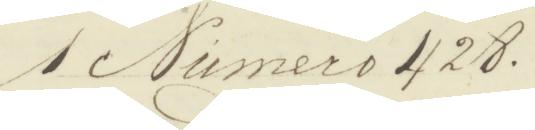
1 Numero 428.
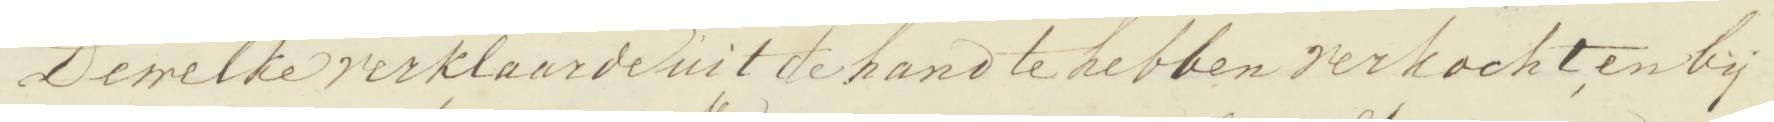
Dewelke verklaarde uit de hand te hebben verkocht, en bij
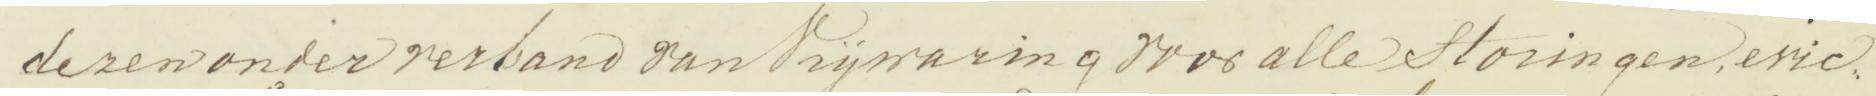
dezen onder verband van Vrijwaring voor alle storingen, evic„
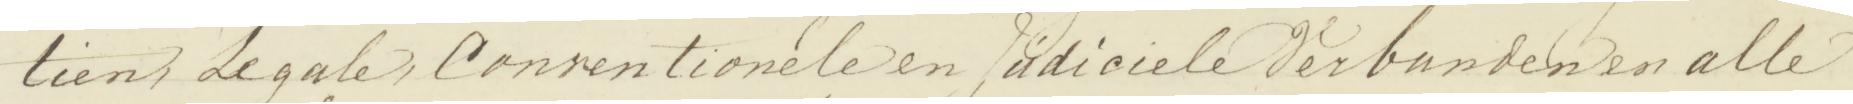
tien, Legale, Conventionele en Judiciele Verbanden en alle
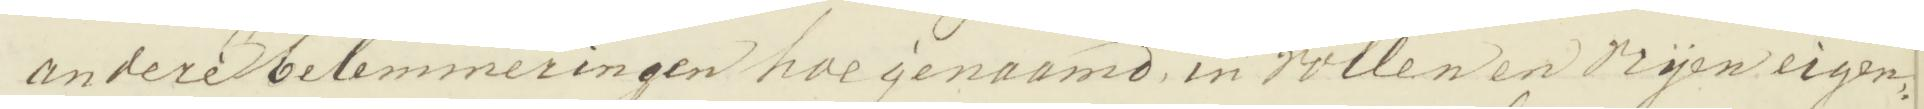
andere belemmeringen hoe genaamd, in vollen en vrijen eigen„
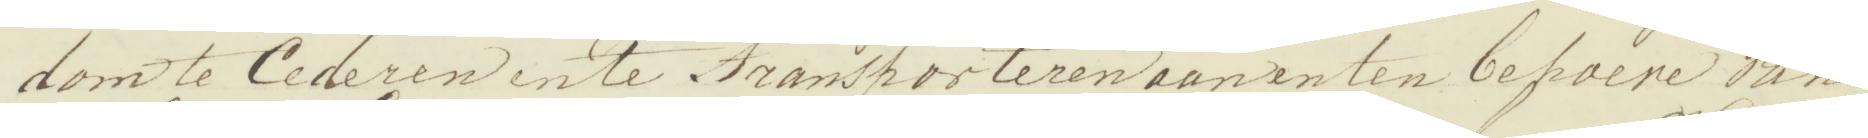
dom te Cederen en te Transporteren aan en ten behoeve van
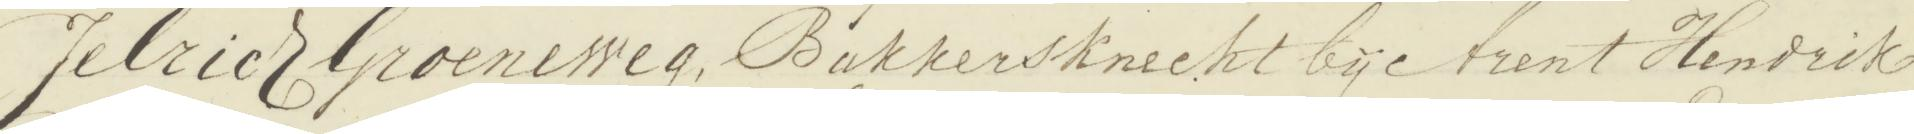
Jelrich Groeneweg, Bakkersknecht bij Arent Hendrik
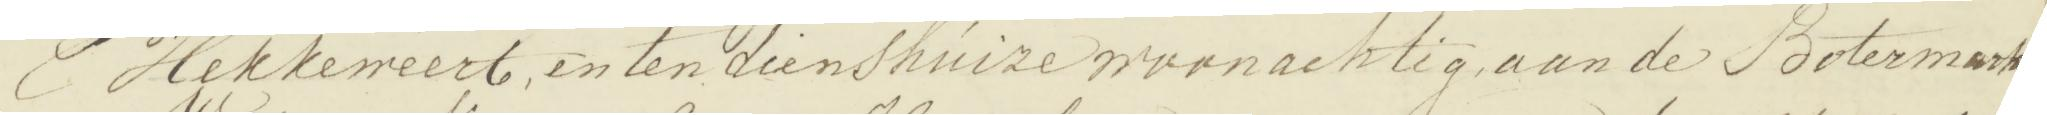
Hekkeweert, en ten dienshuize woonachtig, aan de Botermarkt
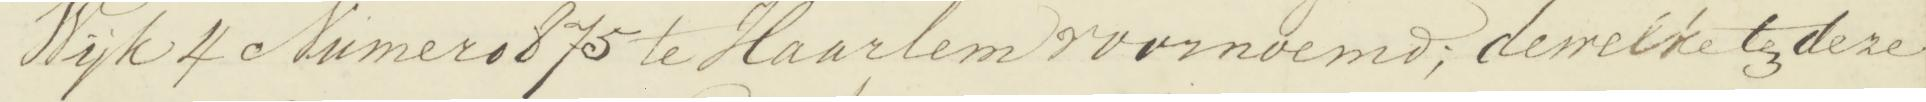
Wijk 4 Numero 875 te Haarlem voornoemd; dewelke ten deze
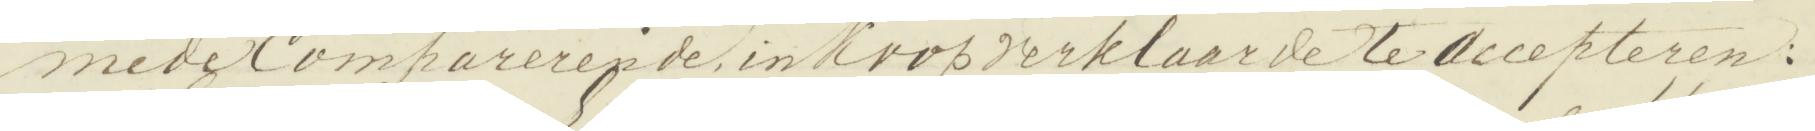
mede Comparerende, in koop verklaarde te accepteren:
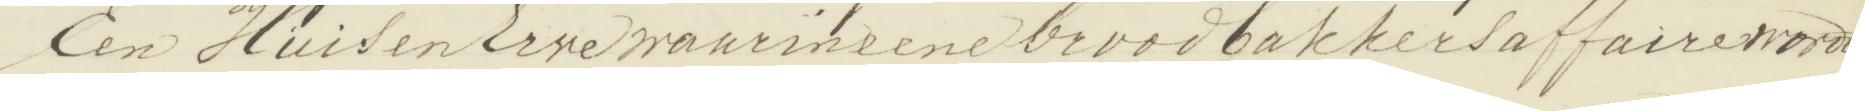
Een Huis en erve waarin eene broodbakkers affaire wordt
